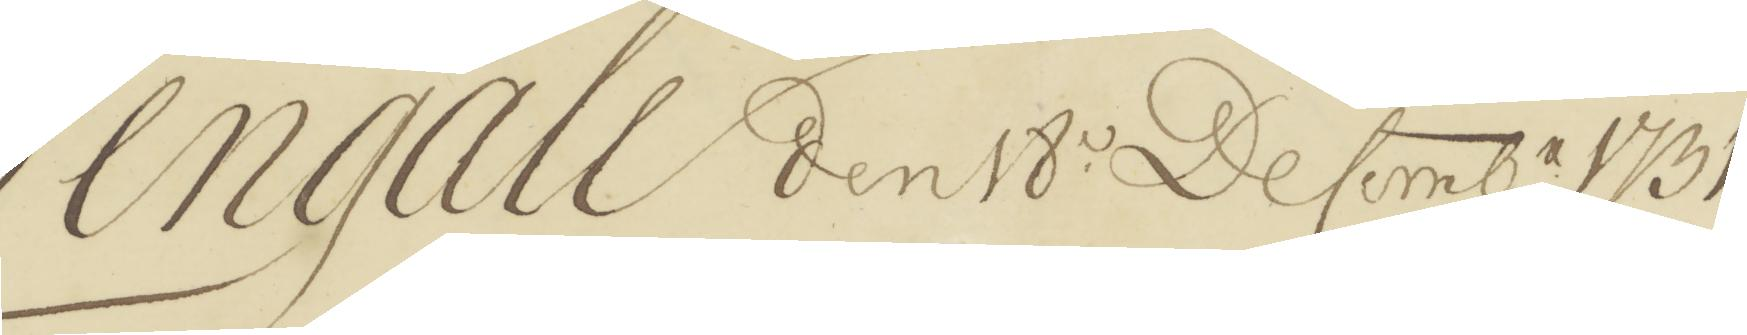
Van Bengale den 18:' Decemb:r 1731
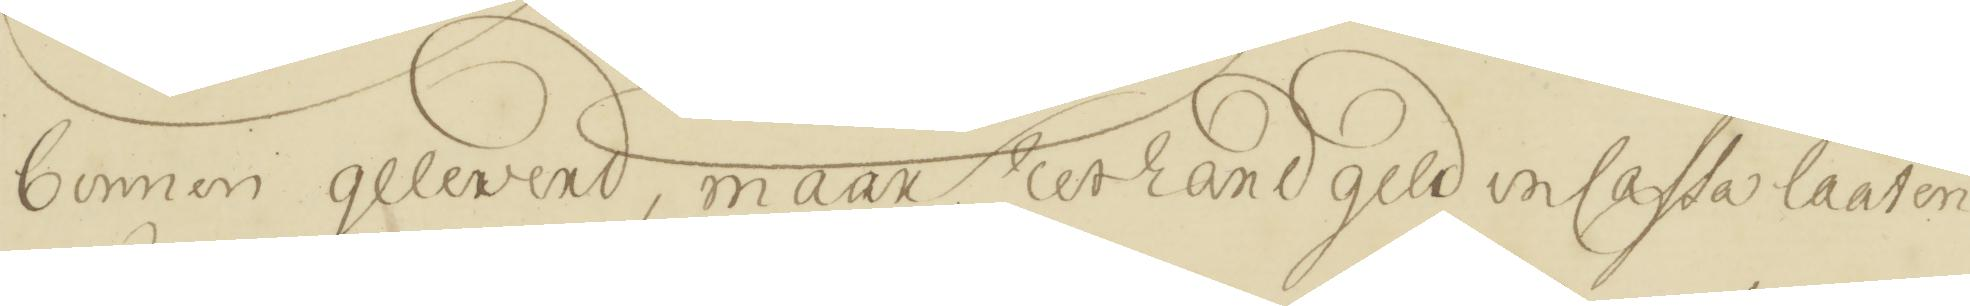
bonnen geleverd, maar het handgeld in Cassa laaten
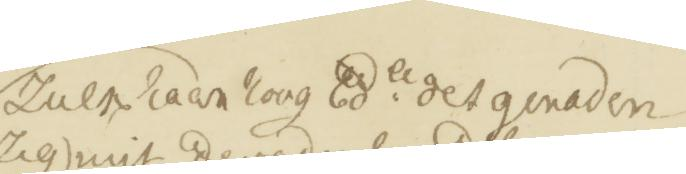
zulk haar hoog Ed„le get genaden
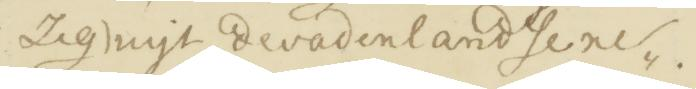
zig uijt de vaderlandse re„
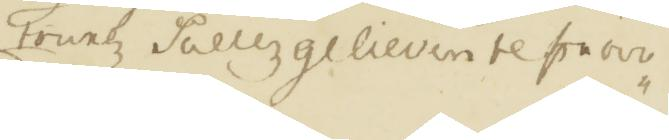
touren sullen gelieven te proce„
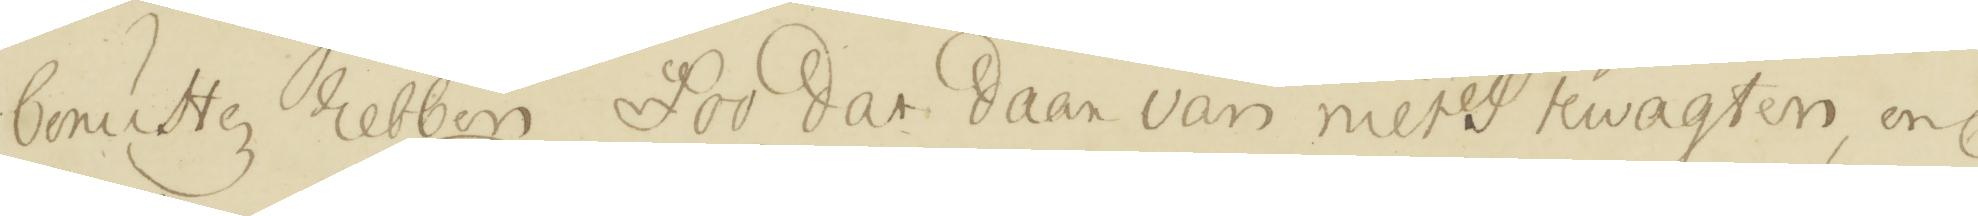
berusten hebben soo dat daar van niets te wagten, en
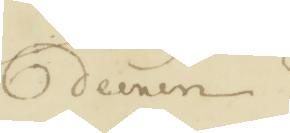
deeren.
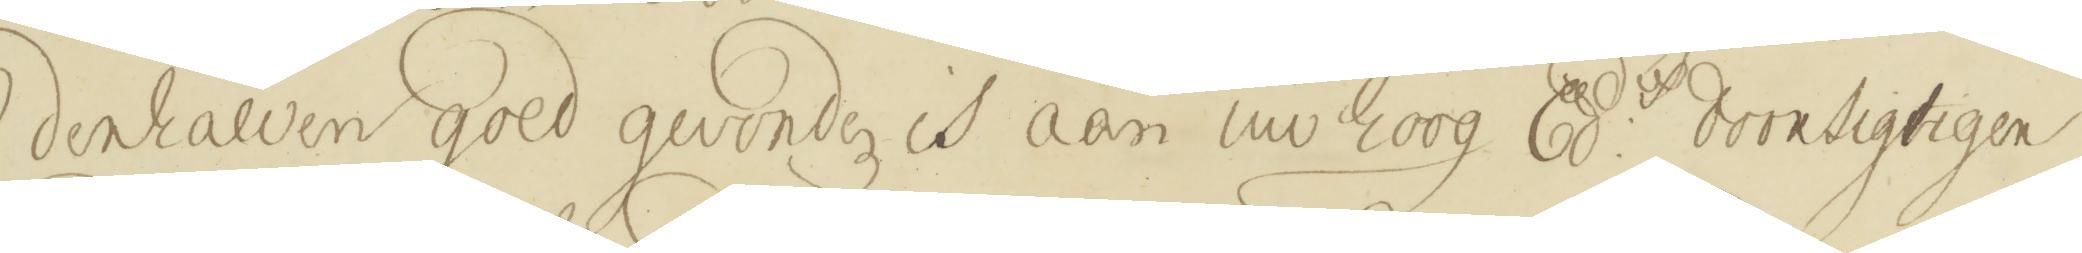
derhalven goed gevonden is aan uw hoog Ed:s doorsigtigen
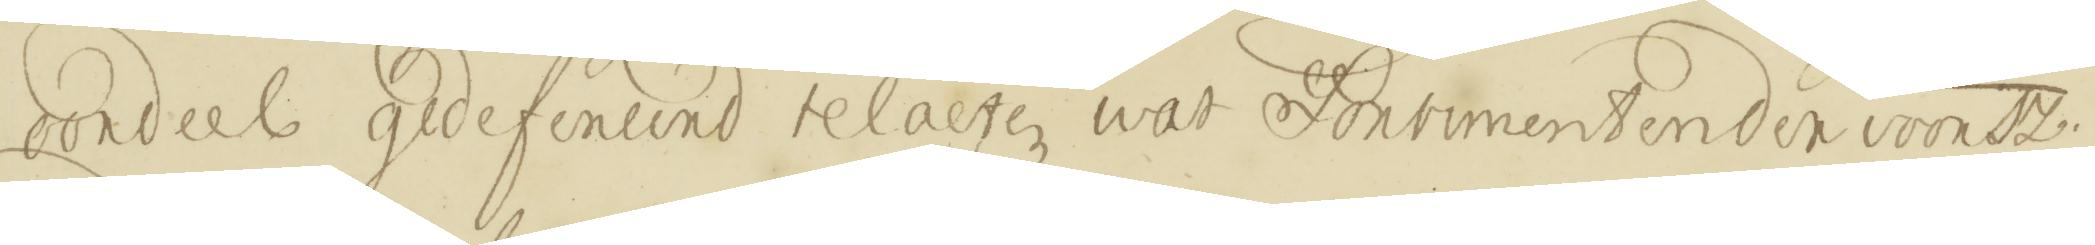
oordeel gedefereerd telaeten wat sortimenten der voorsz
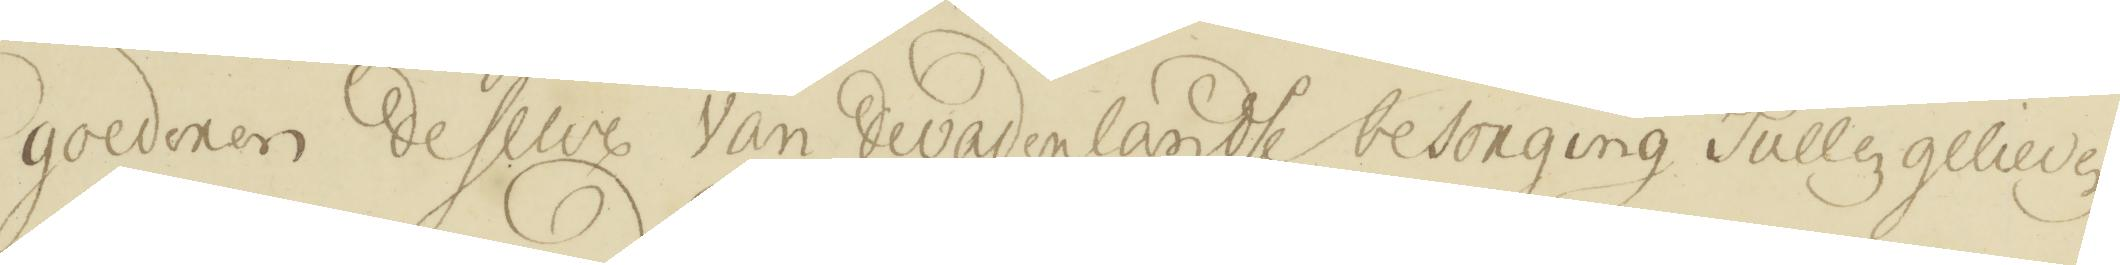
goederen deselve van de vaderlandse besorging sullen gelieven
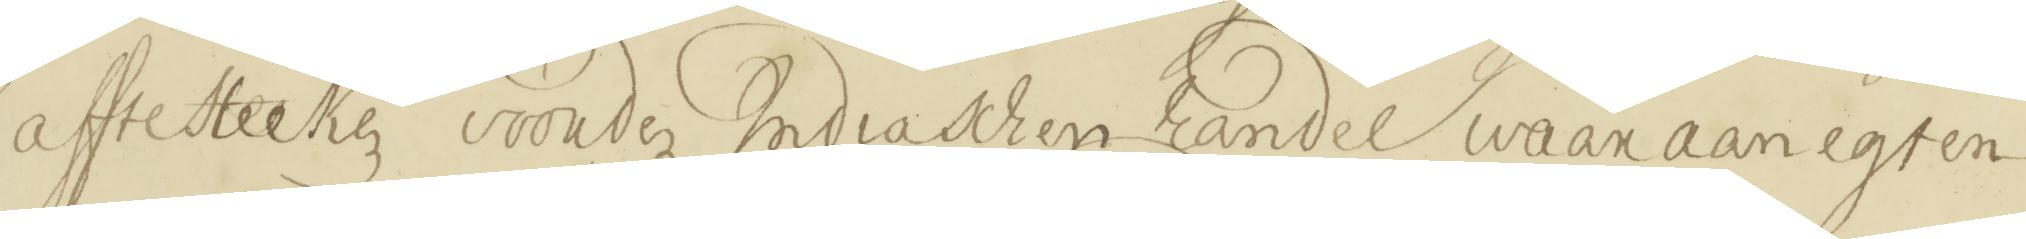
afftesteeken voorden Jndiaschen handel waar aan egten
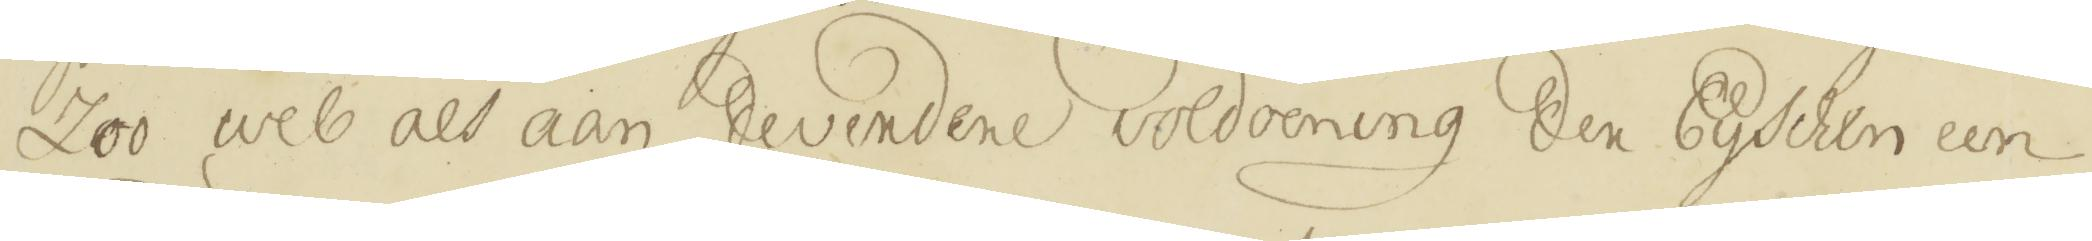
zoo wel als aan de verdere voldoening der Eyschen een
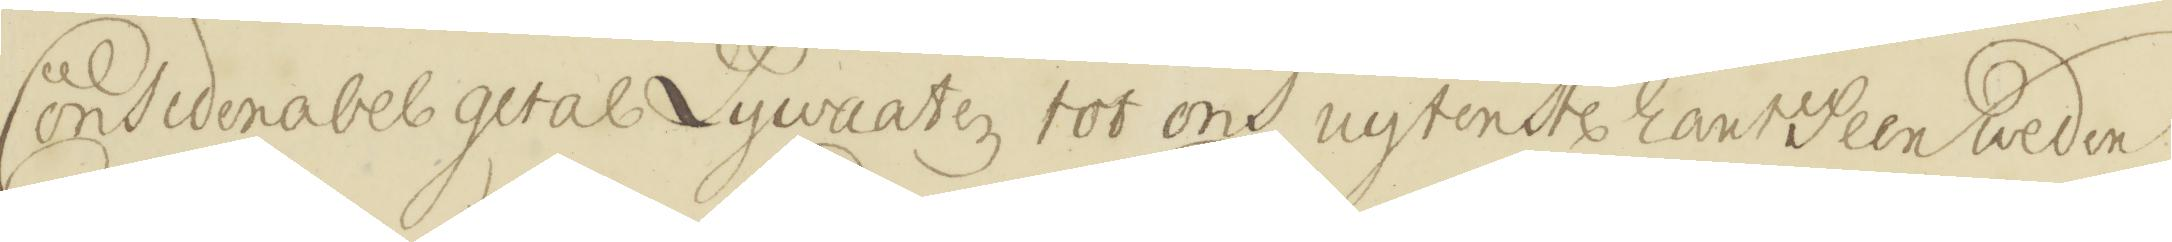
Considerabel getal Lywaaten tot ons uyterste hant seer weder
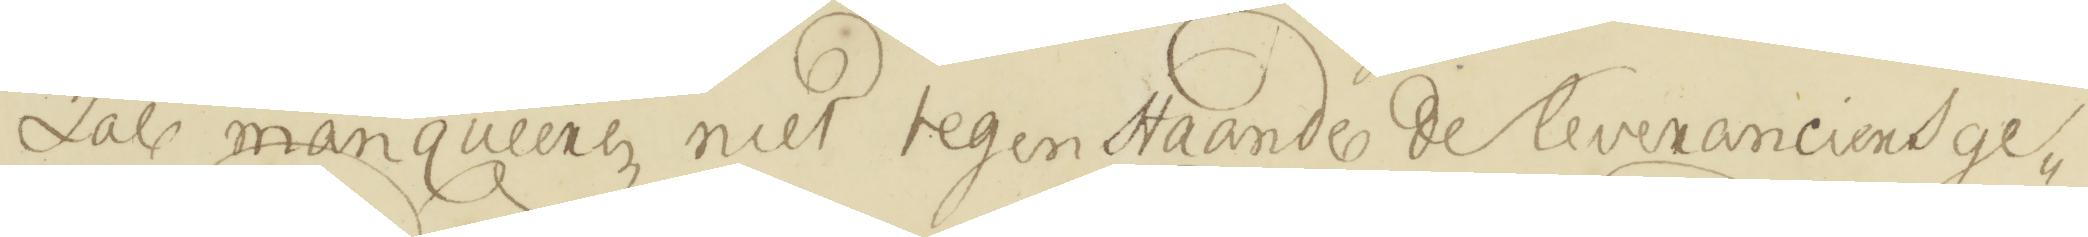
zal manqueeren niet tegenstaande de leveranciers ge„
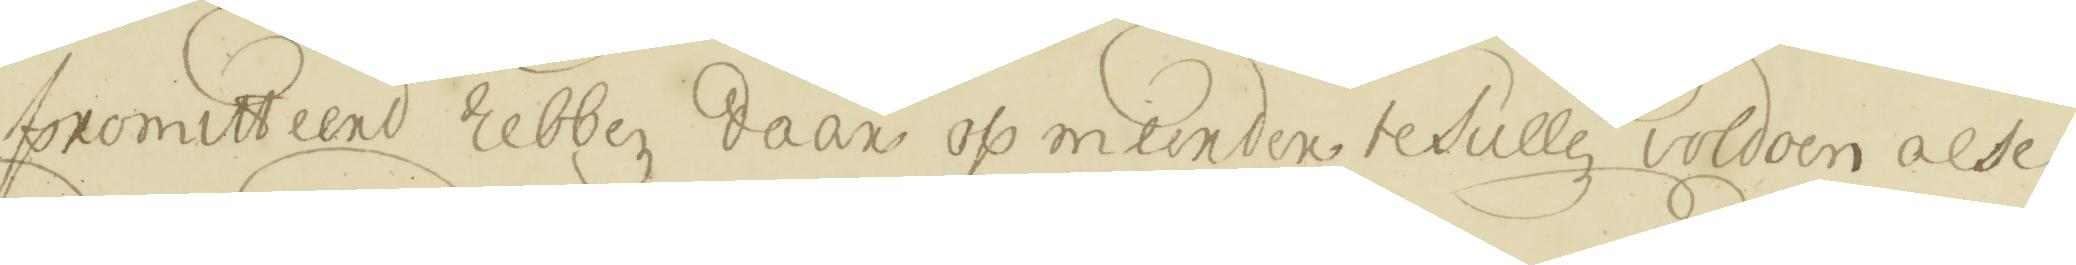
promitteerd hebben daar op meerder te sullen voldoen alse
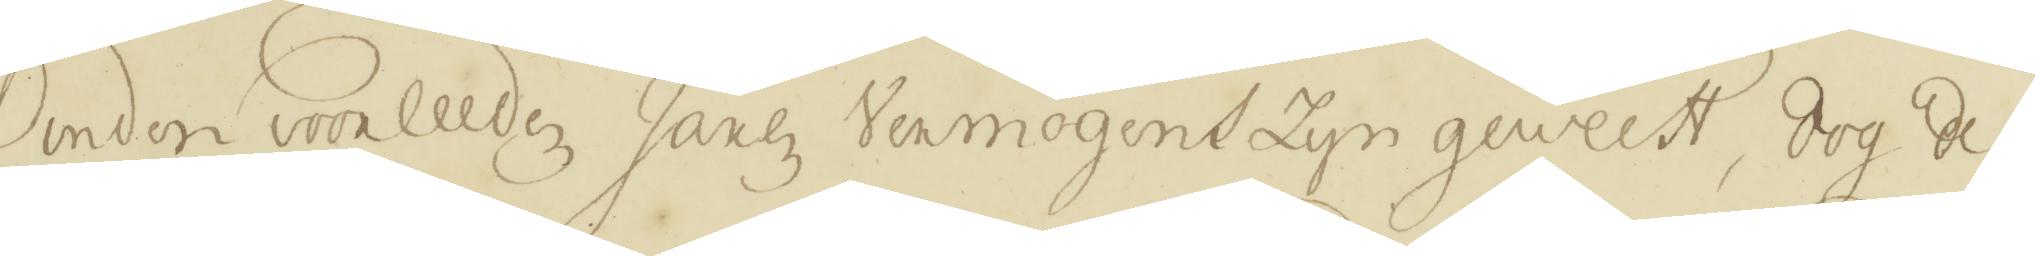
onder voorleeden Jaren vermogens zyn geweest, dog de
